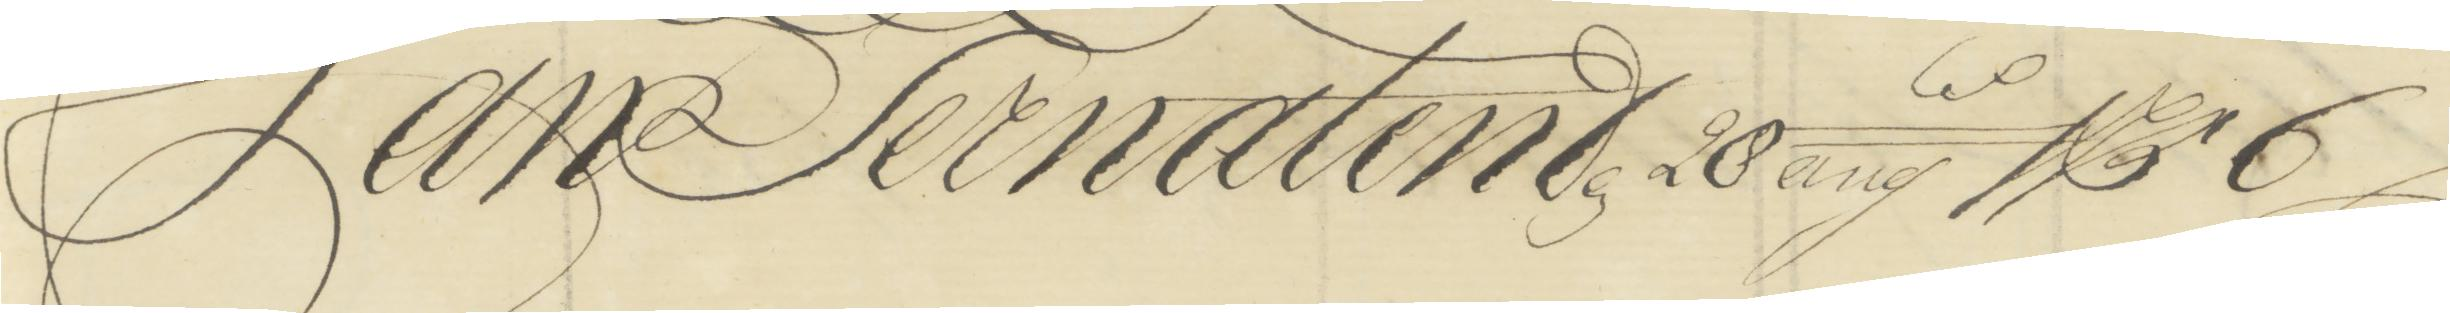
Van Ternaten den 28 aug=s 1756
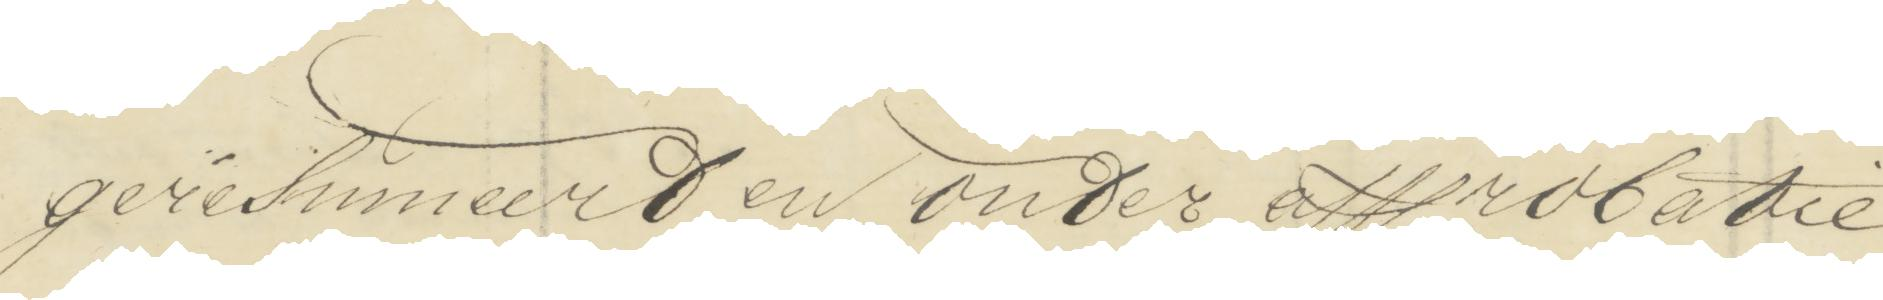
geresumeerd en onder approbatie
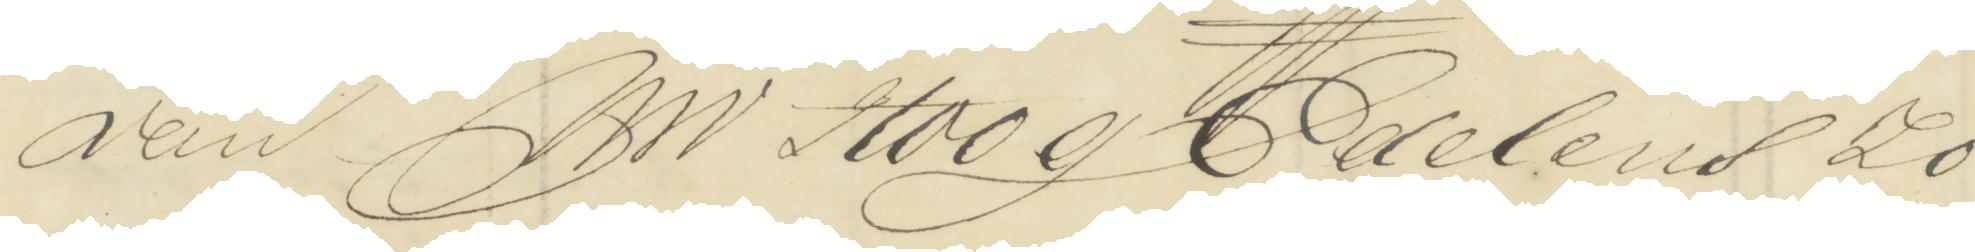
van UW Hoog Edelens zo
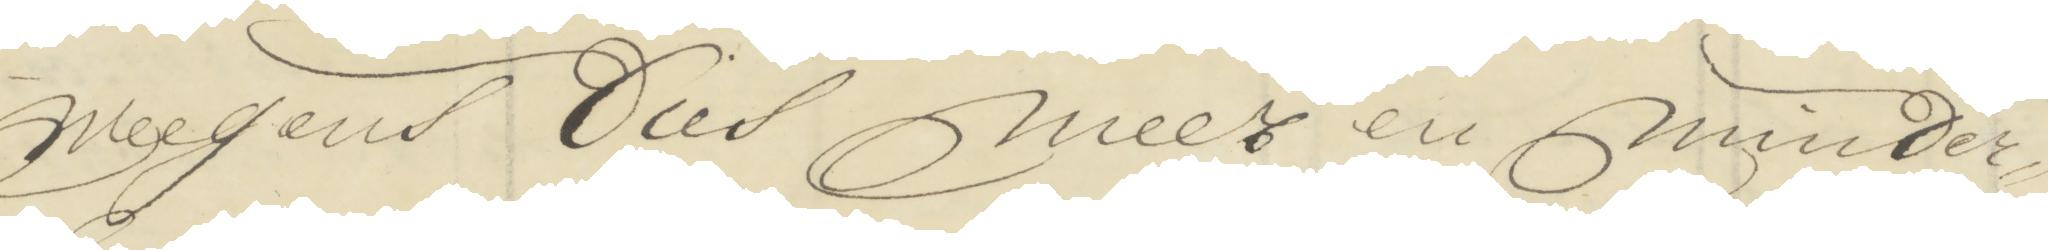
weegens dies meer en minder„
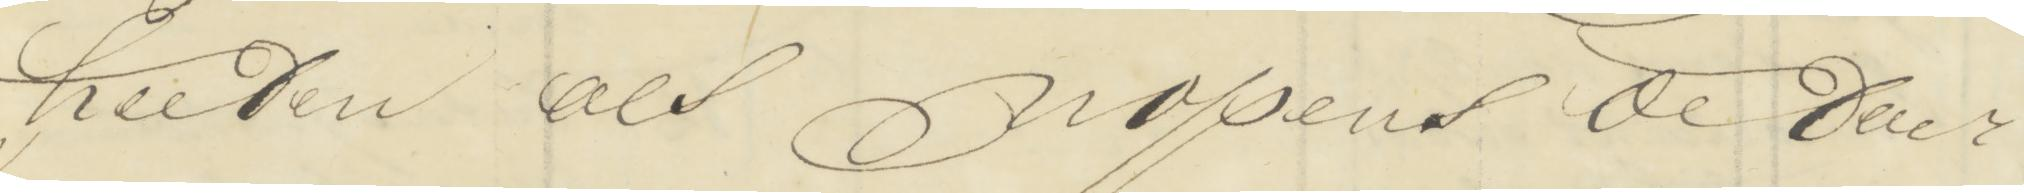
„heeden als nopens de daer
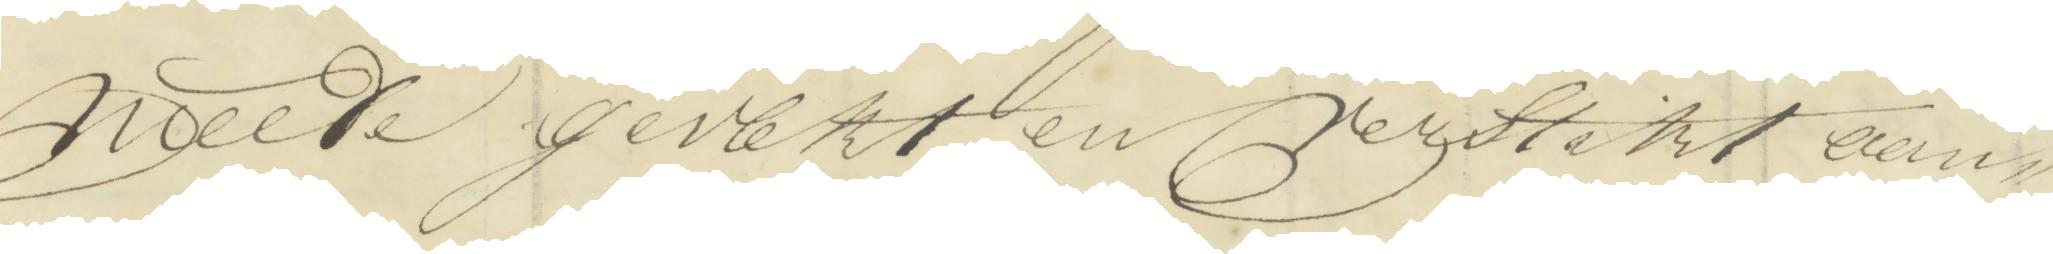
meede gevlekt en verstikt aan„
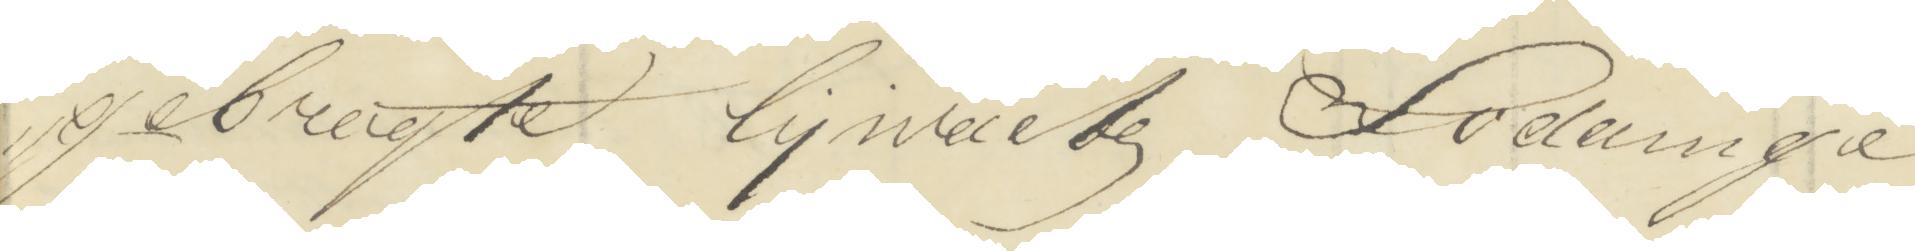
„gebragte lijwaeten sodanige
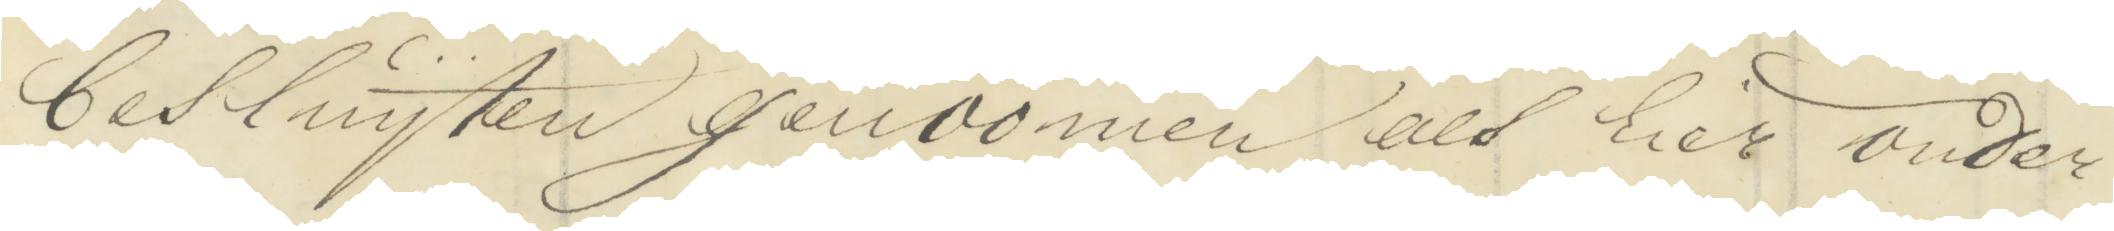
besluijten genoomen als hier onder
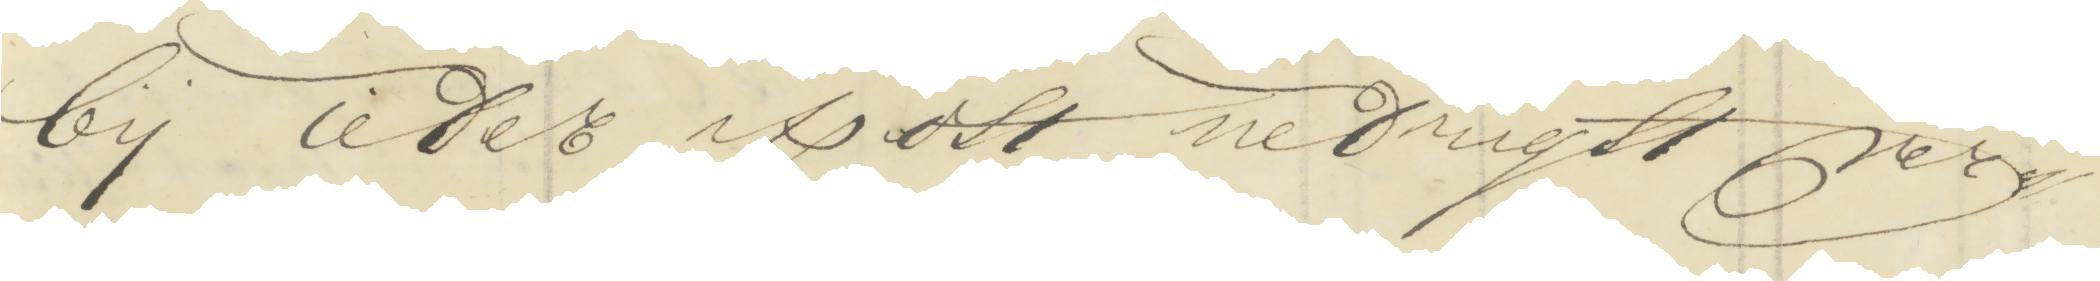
bij ieder post nedrigst ver„
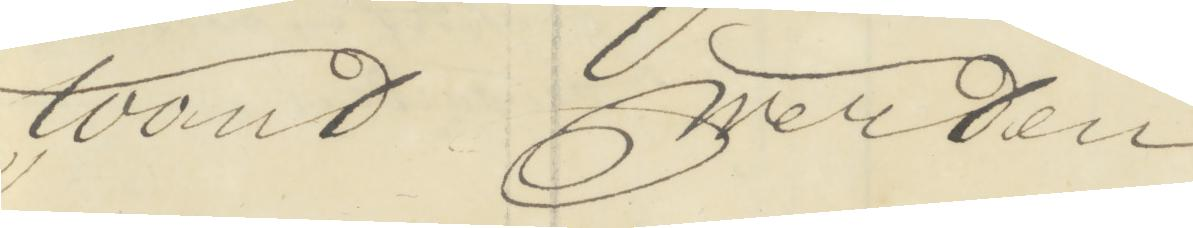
„toond werden
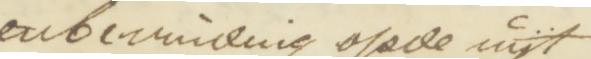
en bevinding opde uijt
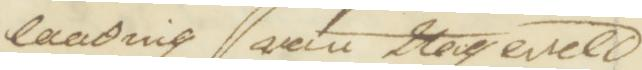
laading van stegeveld
